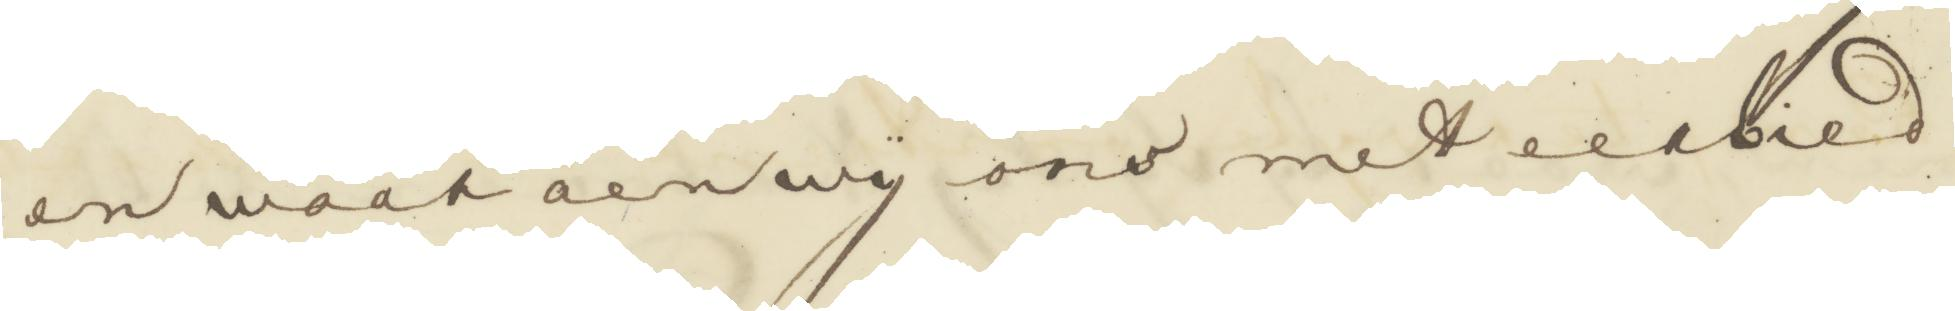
en waar aen wij ons met eerbied
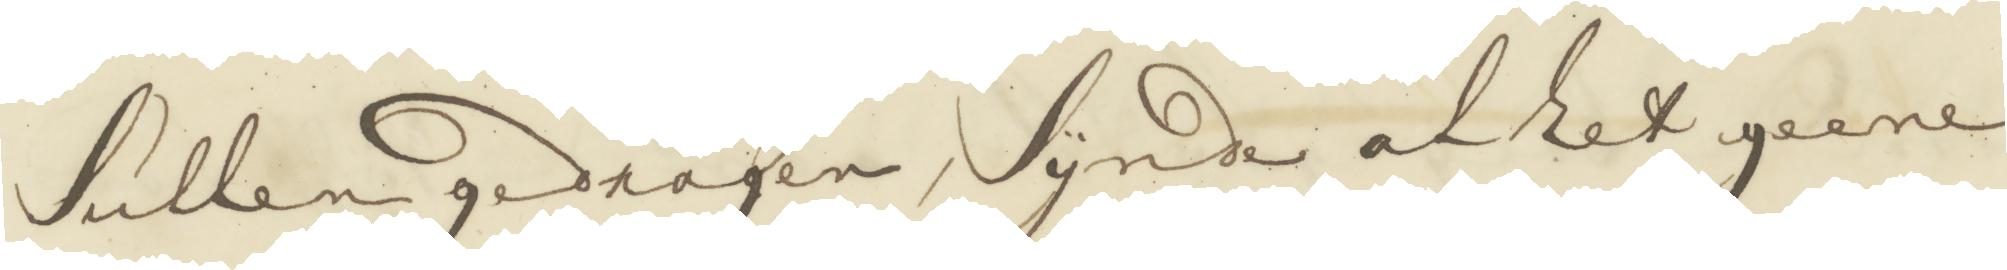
sullen gedragen, Sijnde al het geene
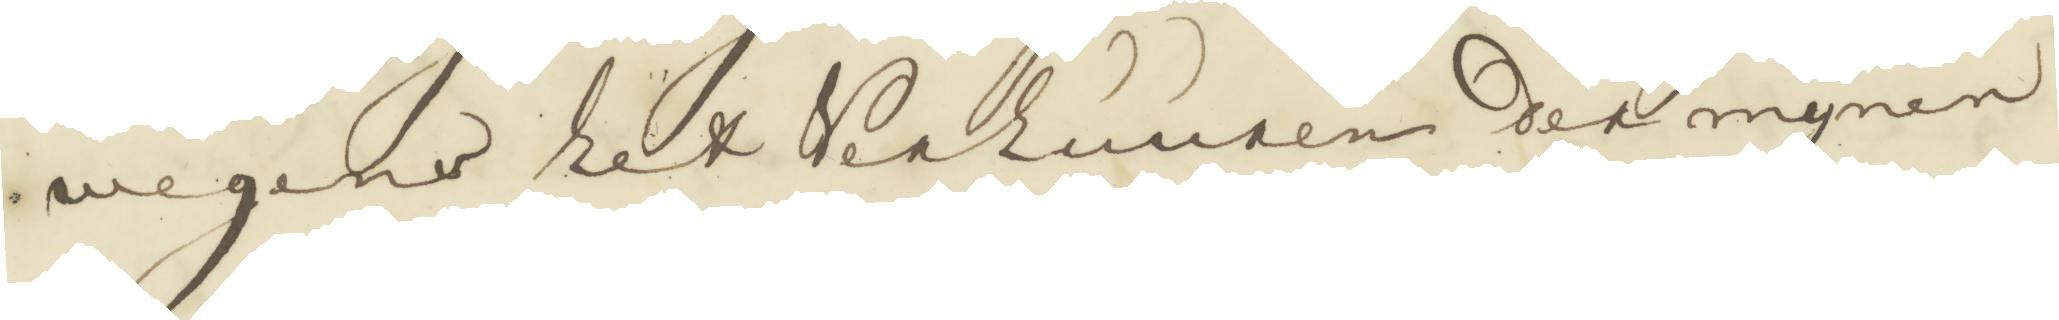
wegens het Verhuuren der mijnen
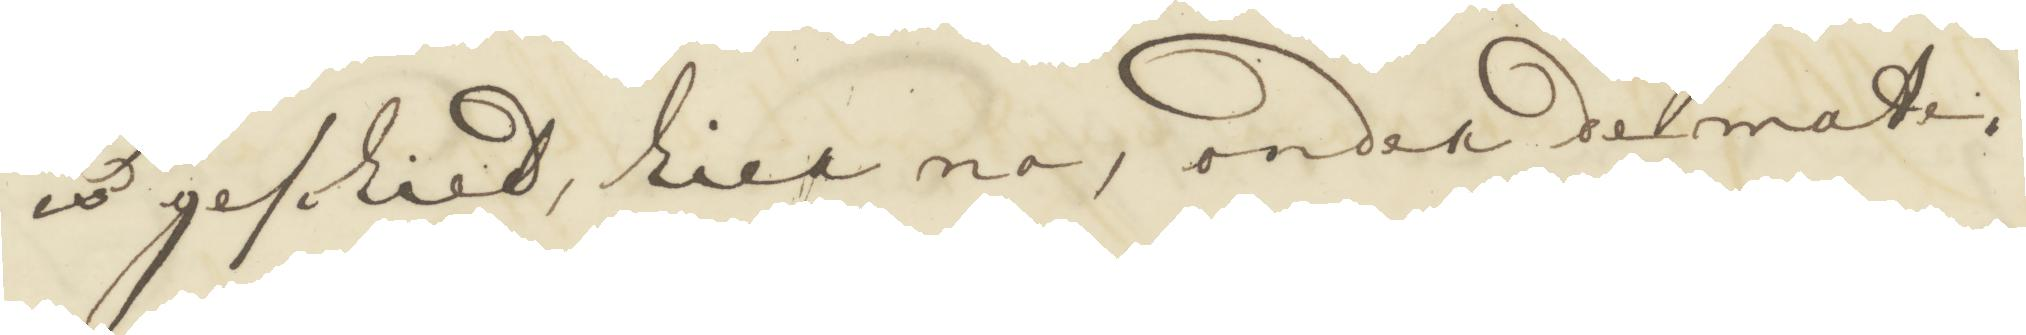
is geschied, hier na, onder de mate„
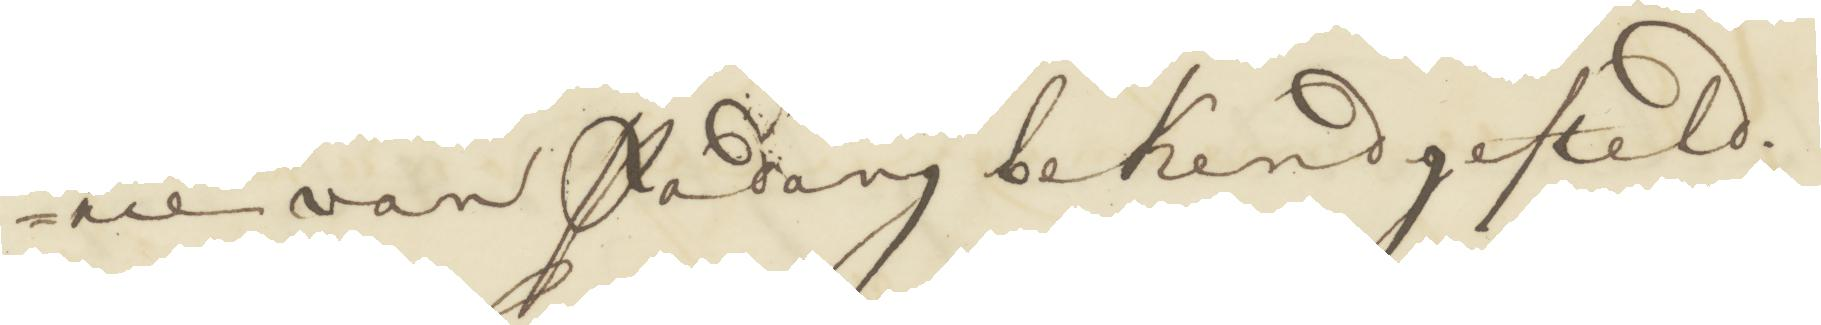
„rie van Padang bekend gesteld.
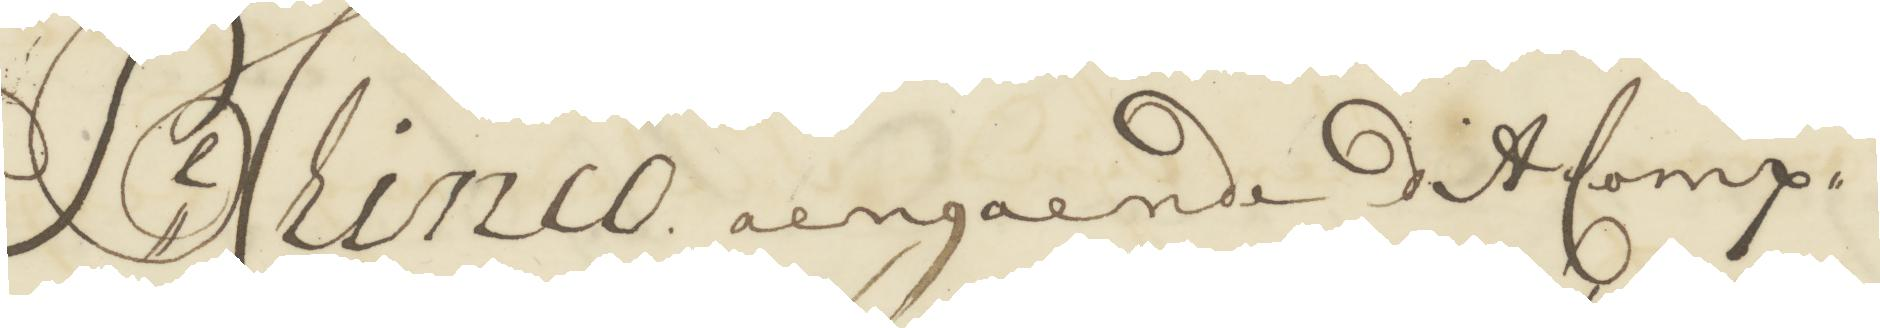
P„l Chinco. aengaende dit Comp„
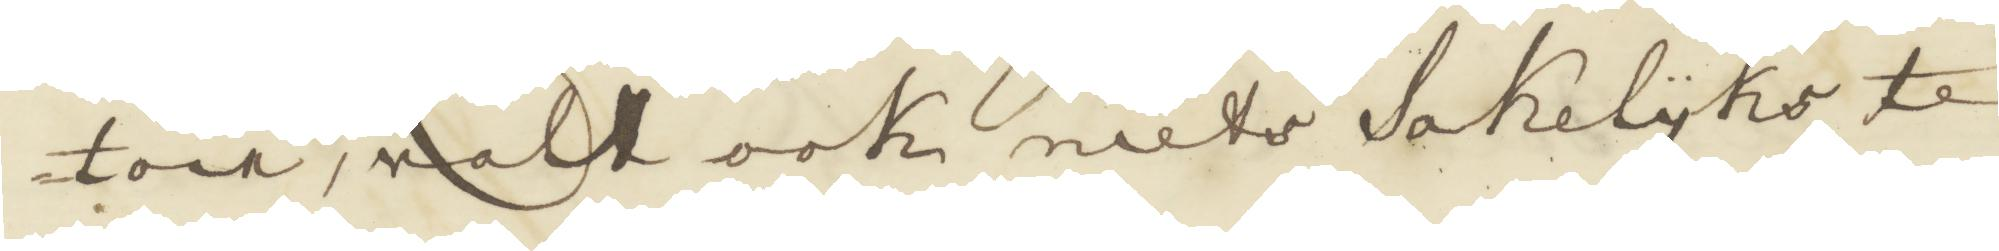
„toir, valt ook niets Sakelijks te
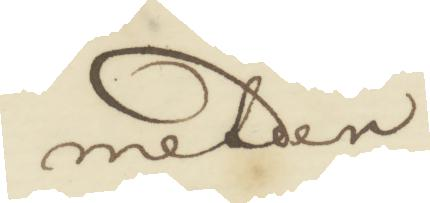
melden
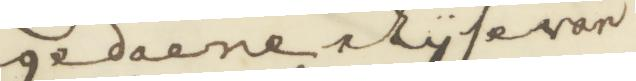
gedaene rhijse van
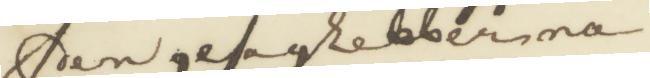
den gesaghebber na
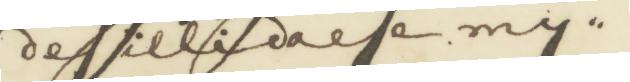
de sillidaese mij„
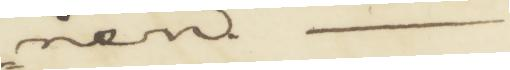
„nen.
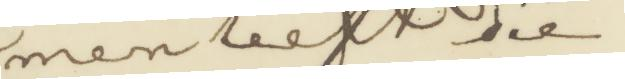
men heeft die
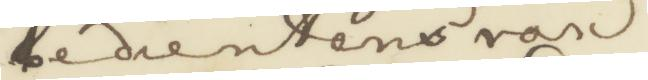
bedientens van
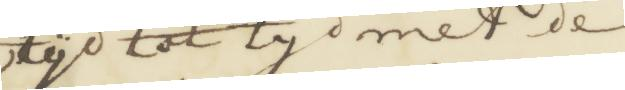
tijd tot tijd met de
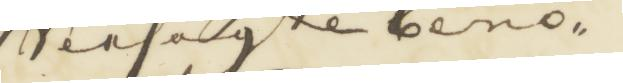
Versogte beno„
